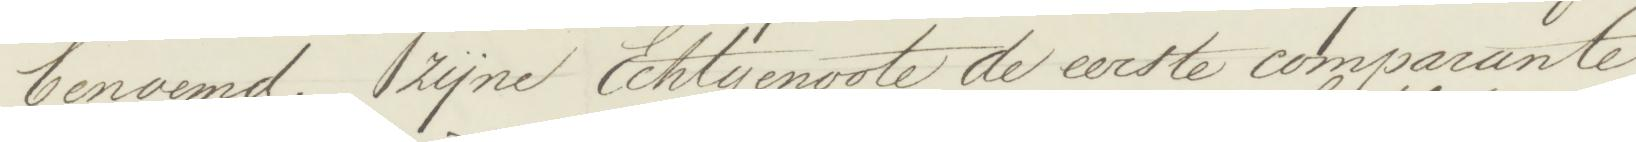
benoemd, zijne Echtgenoote de eerste comparante
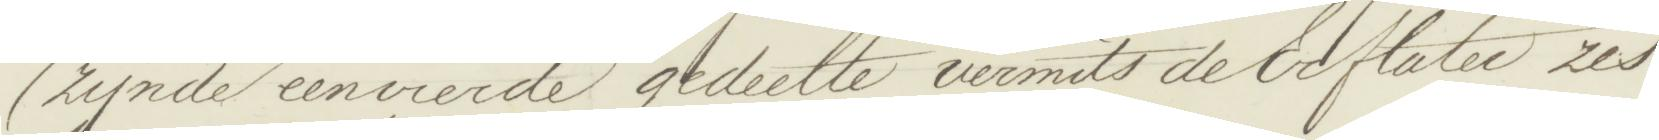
(zynde een vierde gedeelte vermits de Erflater zes
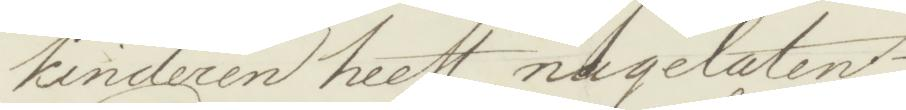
kinderen heeft nagelaten-)
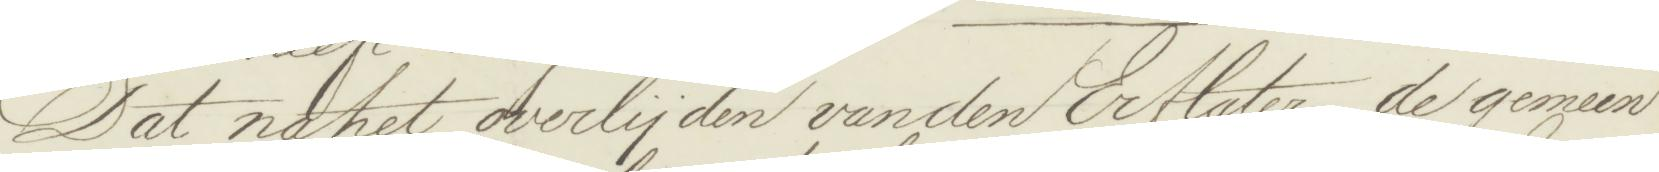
Dat na het overlijden van den Erflater de gemeen
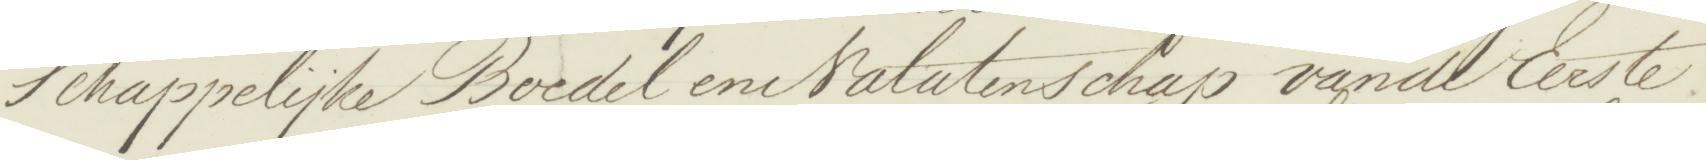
schappelijke Boedel en Nalatenschap van de Eerste
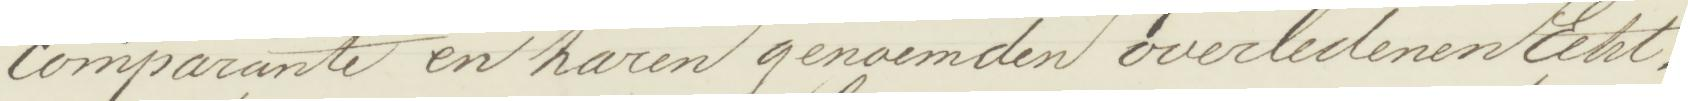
comparante en haren genoemden overledenen Echt„
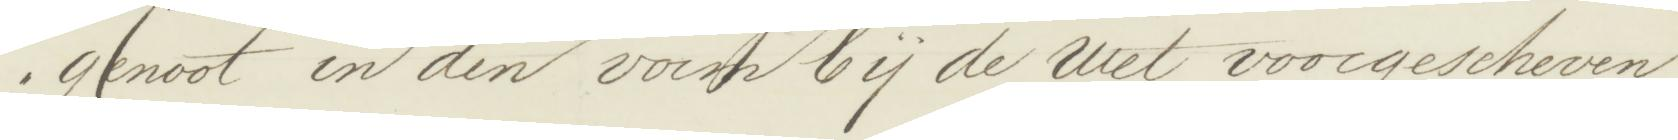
„genoot in den vorm bij de wet voorgescheven,
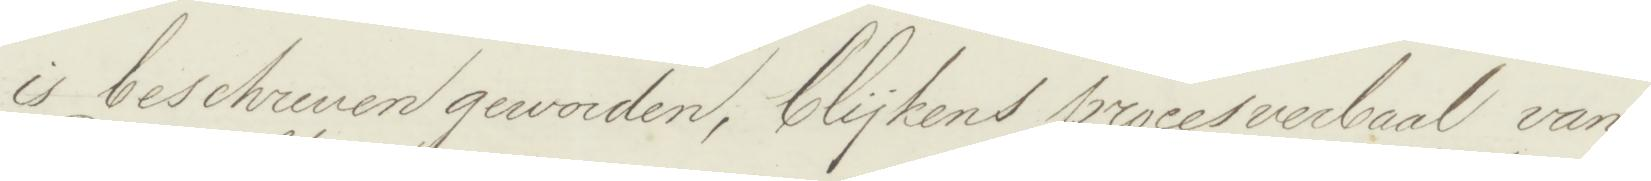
is beschreven geworden, blijkens proces verbaal van
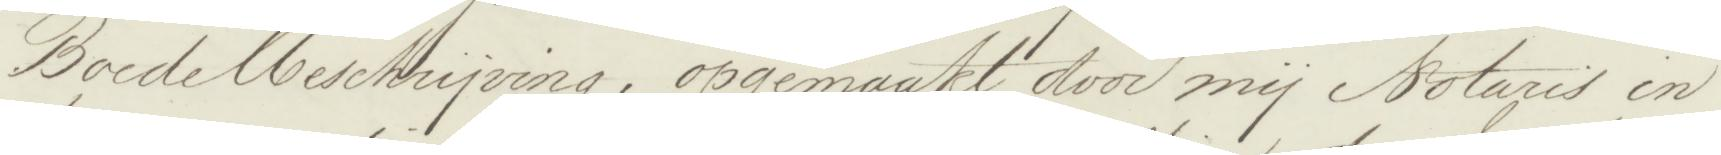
Boedelbeschrijving, opgemaakt door mij Notaris in
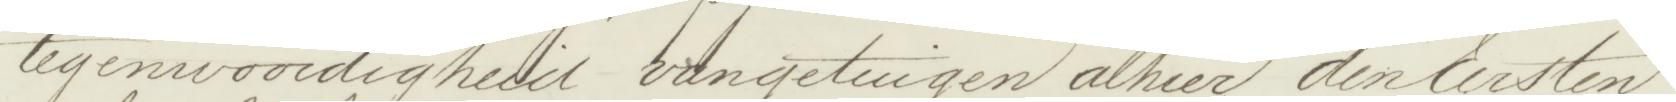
tegenwoordigheid van getuigen alhier den Eersten
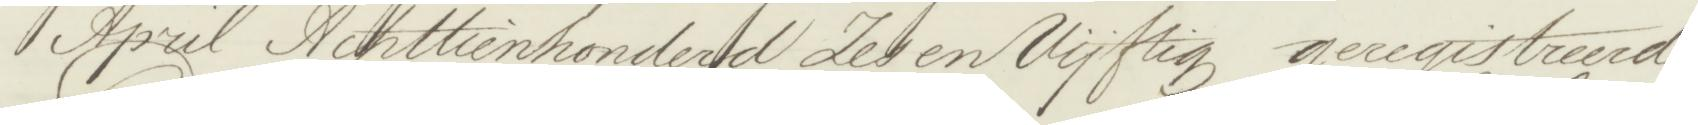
April Achttienhonderd Zes en Vijftig geregistreerd
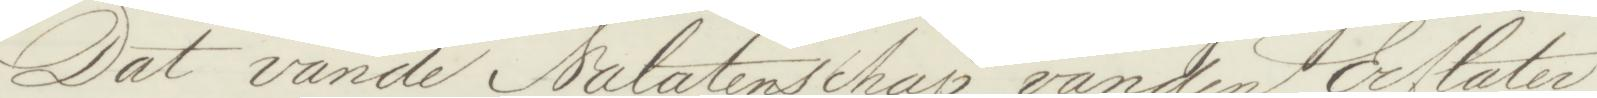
Dat van de Nalatenschap van den Erflater
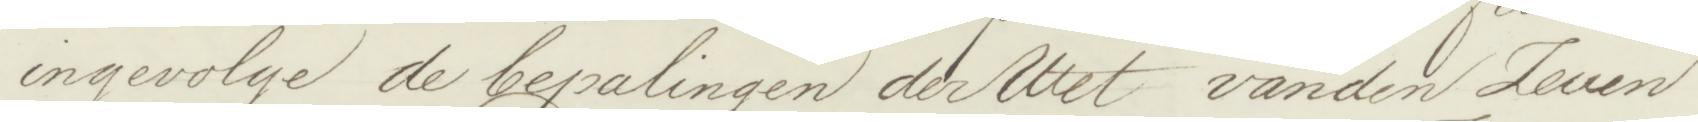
ingevolge de bepalingen der Wet van den Zeven
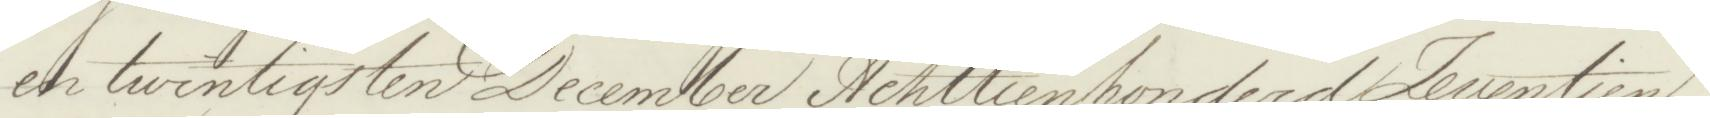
en twintigsten December Achttienhonderd Zeventien,
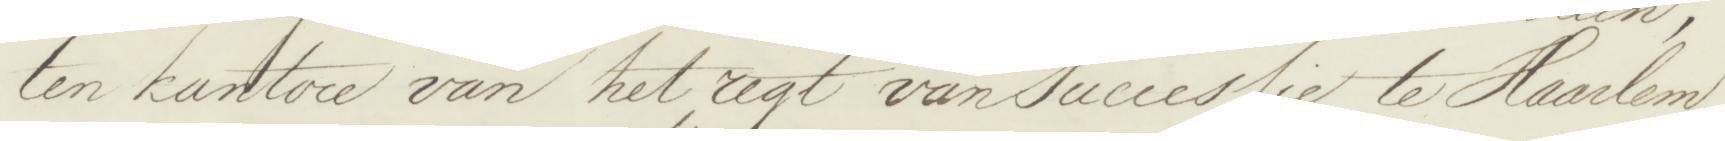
ten kantore van het regt van Successie te Haarlem,
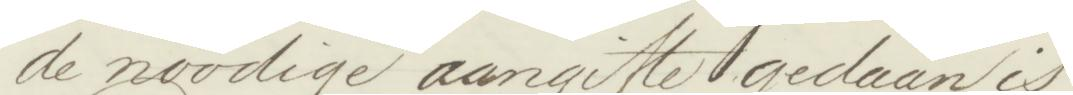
de noodige aangifte gedaan is
